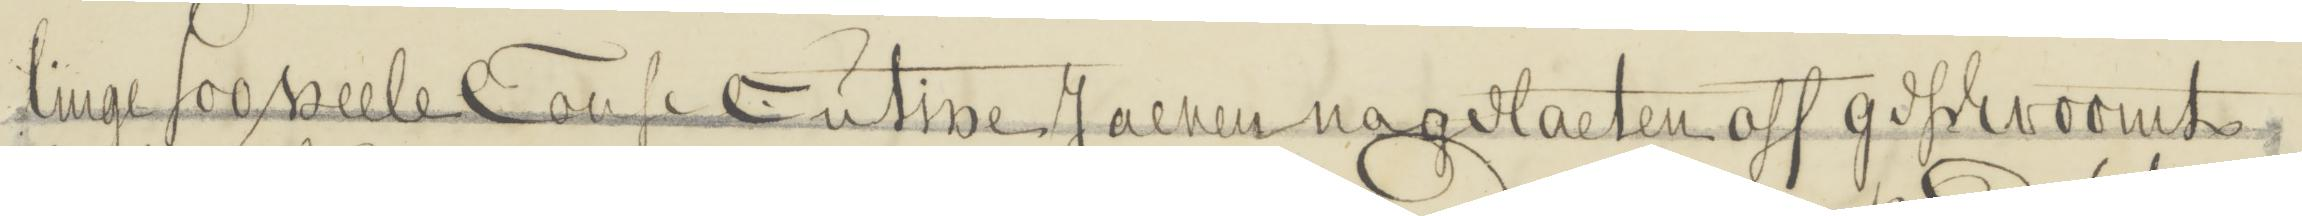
linge soo veele Consecutive Jaeren nagelaeten off geschroomt
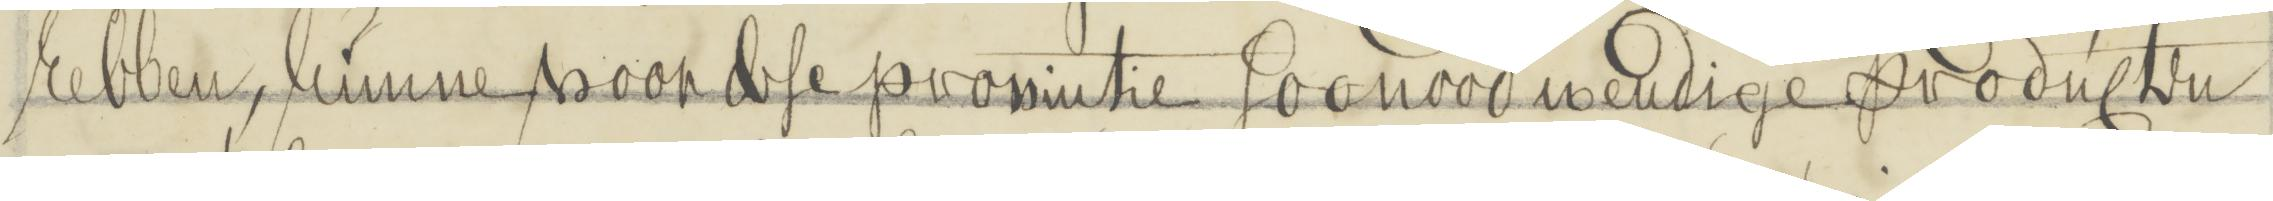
hebben, hunne voor dese provintie soo nood wendige producten
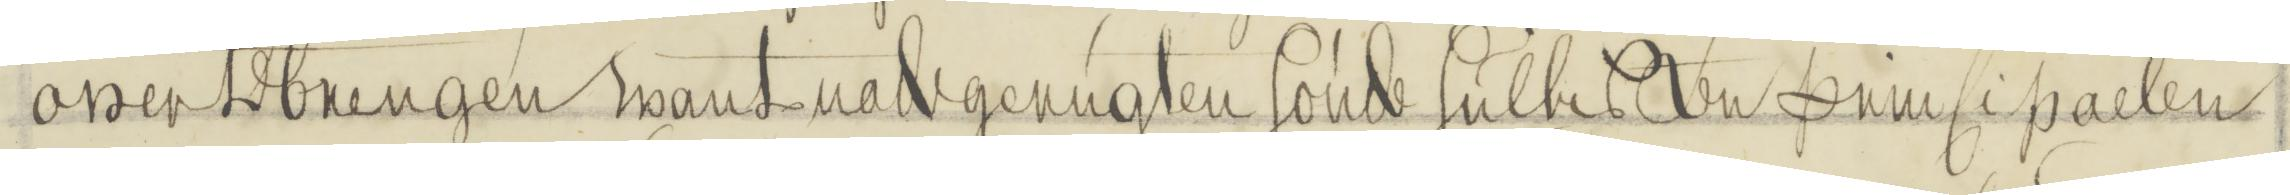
over tebrengen want nade gerugten soude sulks ten principaelen
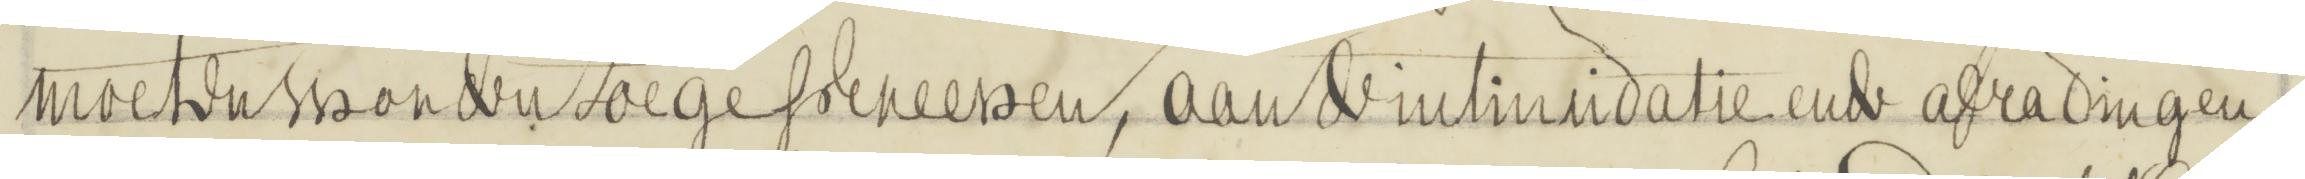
moeten worden toegeschreeven, aan de intimidatie ende afradingen.
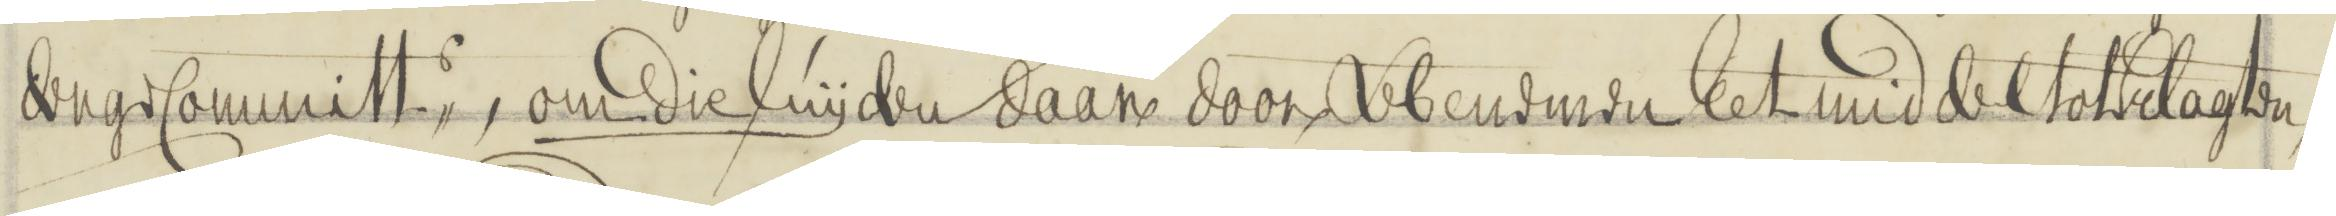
der gecommitt„s, om die luijden daar door te benemen het middel totklagten
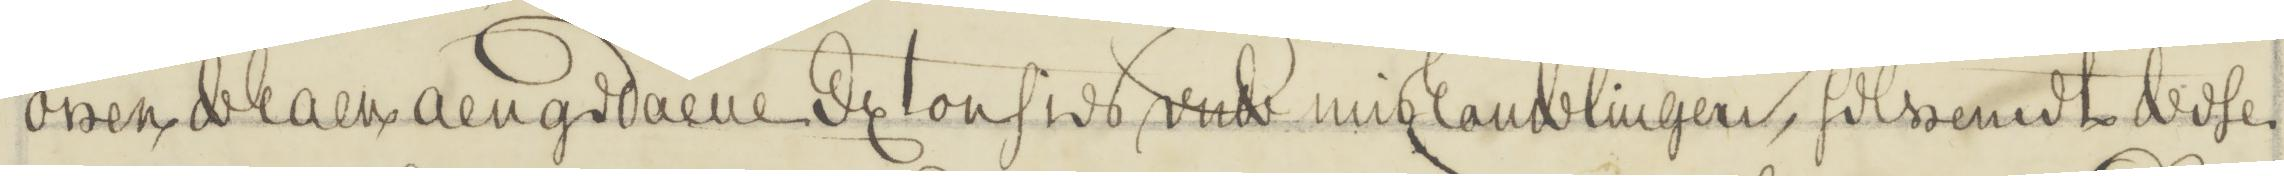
over de haer aengedaene Extorsies ende mishandelingen, selve met deese
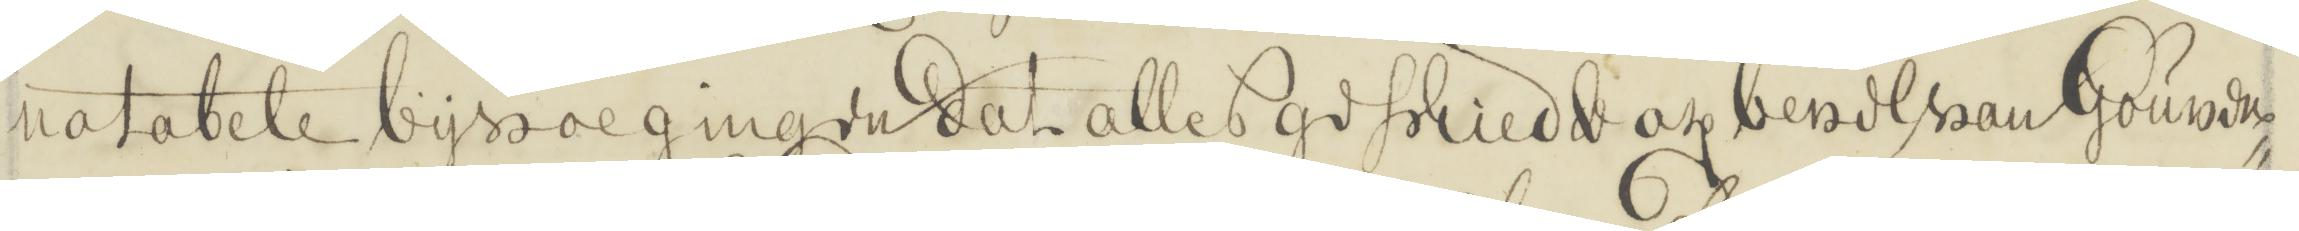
notabele bijvoegingen dat alles geschiedde op bevel van Gouver„
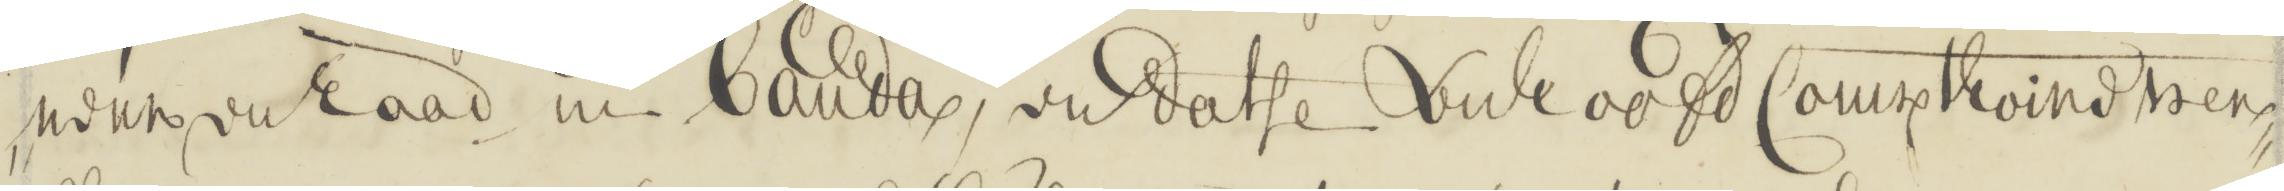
„neur en raad in banda, en datse tenhoofd Compthoire ver„
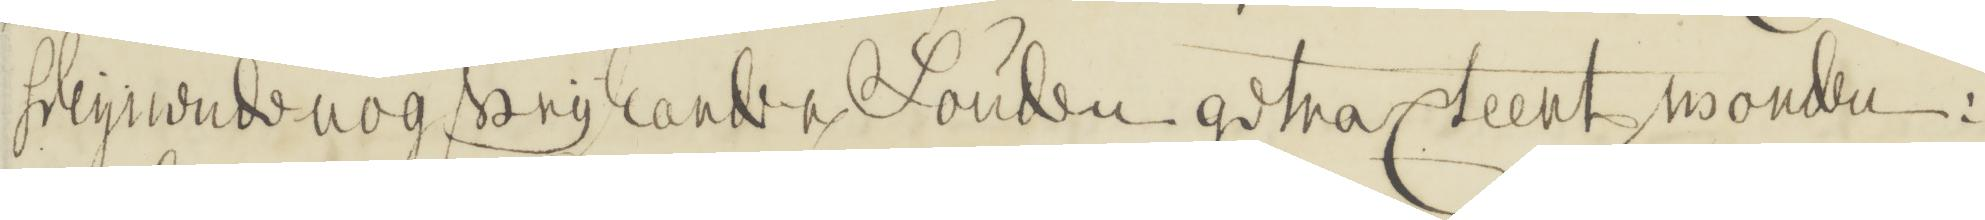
schijnende nog vrij harder souden getracteert worden:
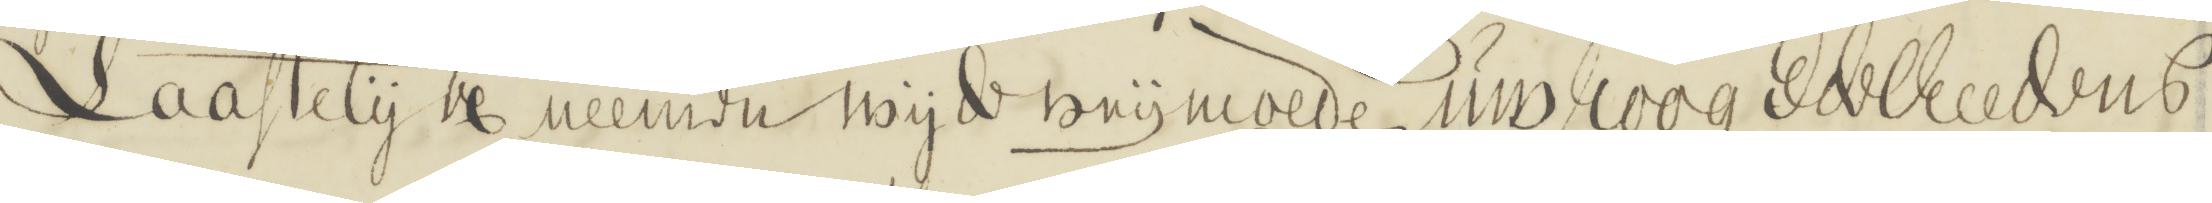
Laastelijk neemen wij de vrijmoede uw hoog Edelheedens
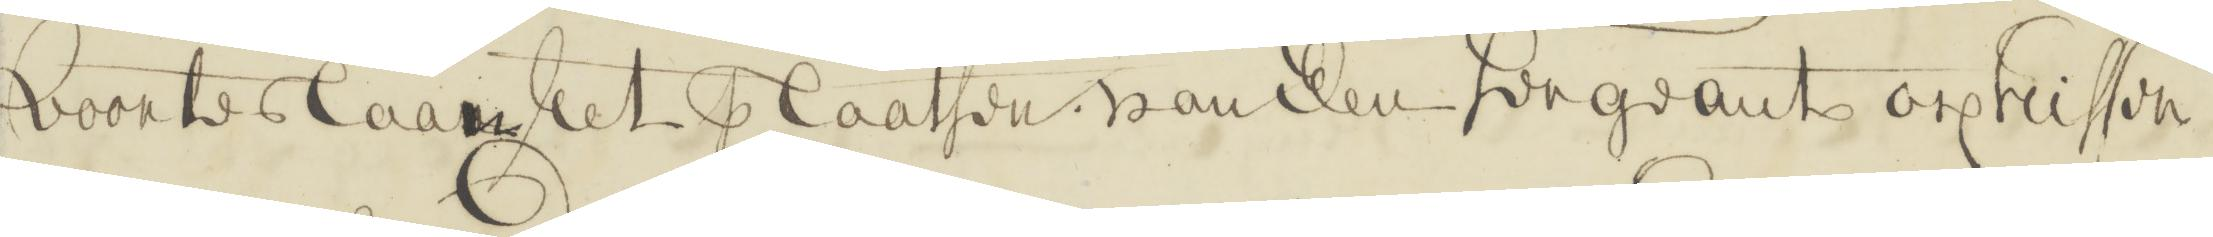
voor te slaan het plaatsen van Een sergeant op kissen
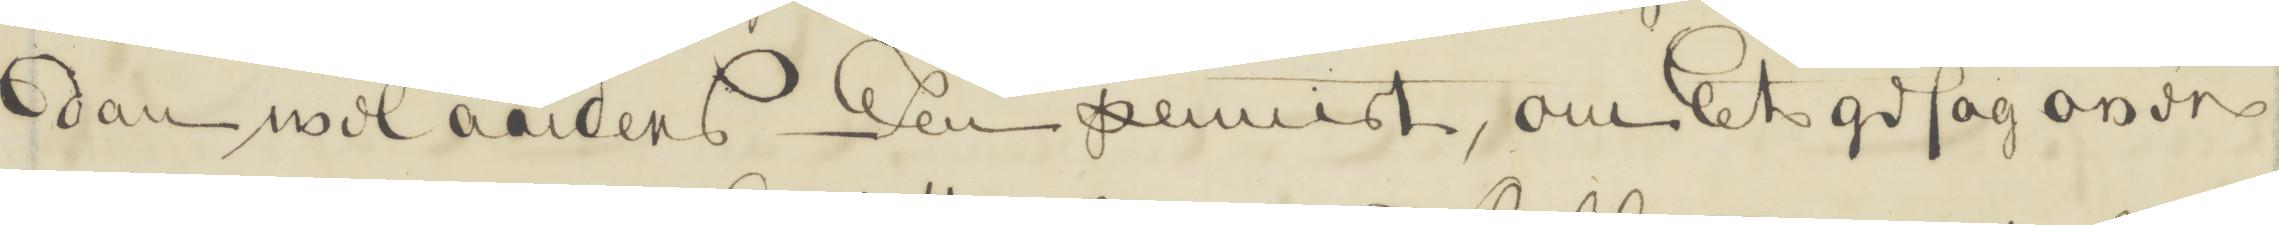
dan wel anders Een pennist, om het gesag over
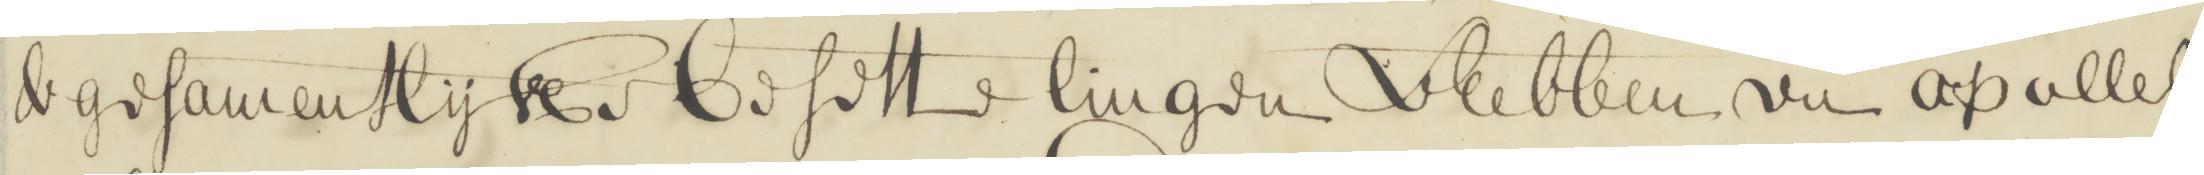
de gesamentlijke besette lingen te hebben, en op alles
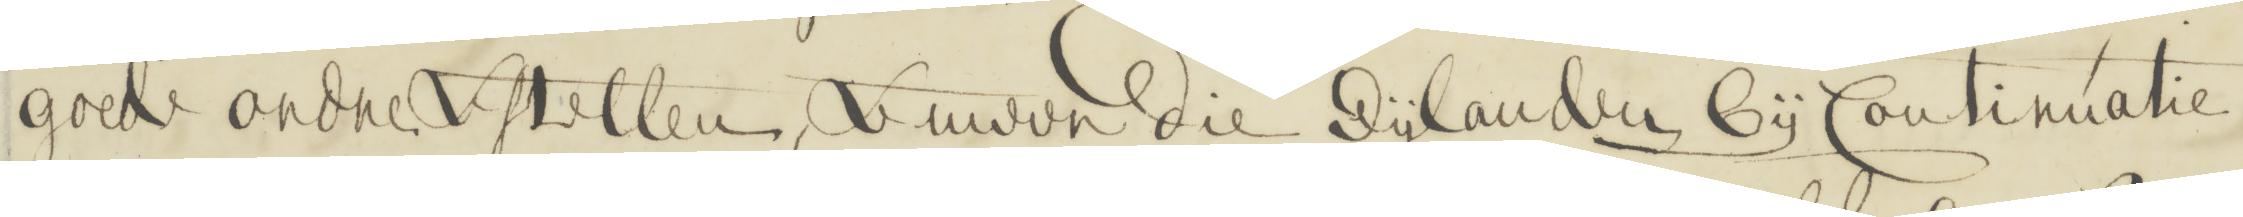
goede ordre testellen, temeer die Eijlanden bij Continuatie
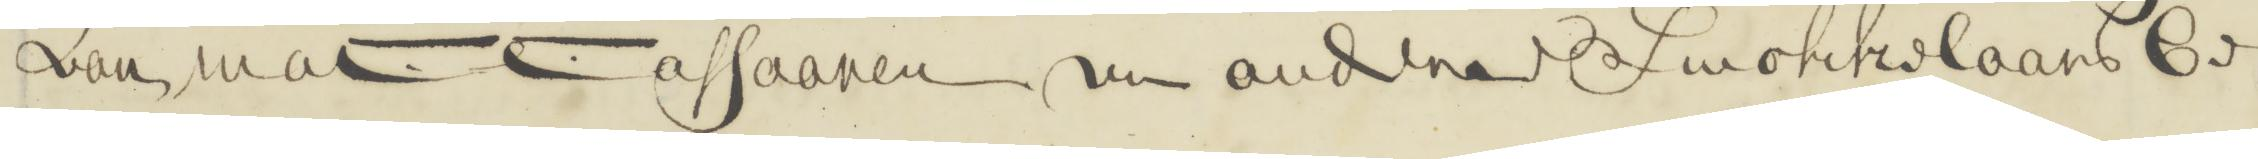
van maccassaaren, en andere smokkelaars be
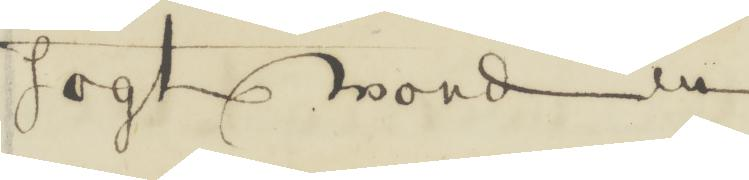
sogt worden
